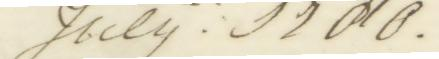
Julij: 1780.
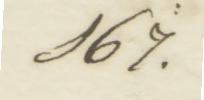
167.
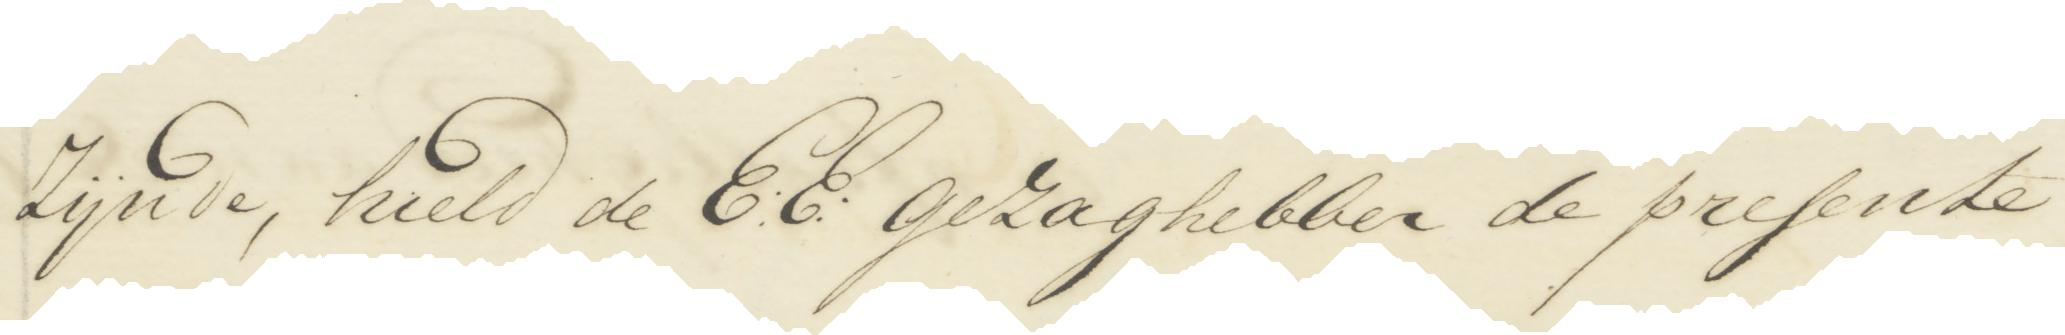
zijnde, hield de E:E: gezaghebber de presente
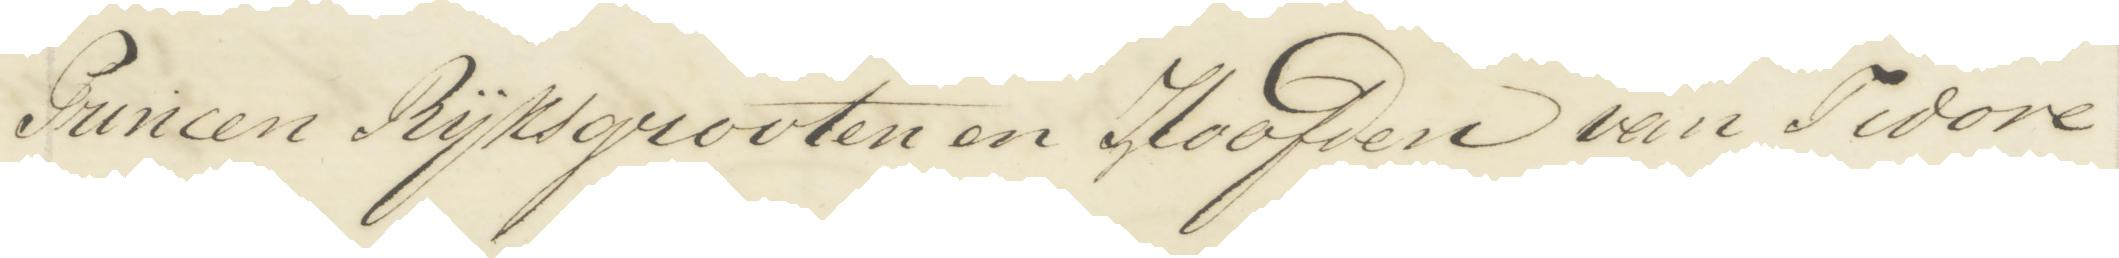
Princen Rijksgrooten en Hoofden van Tidore
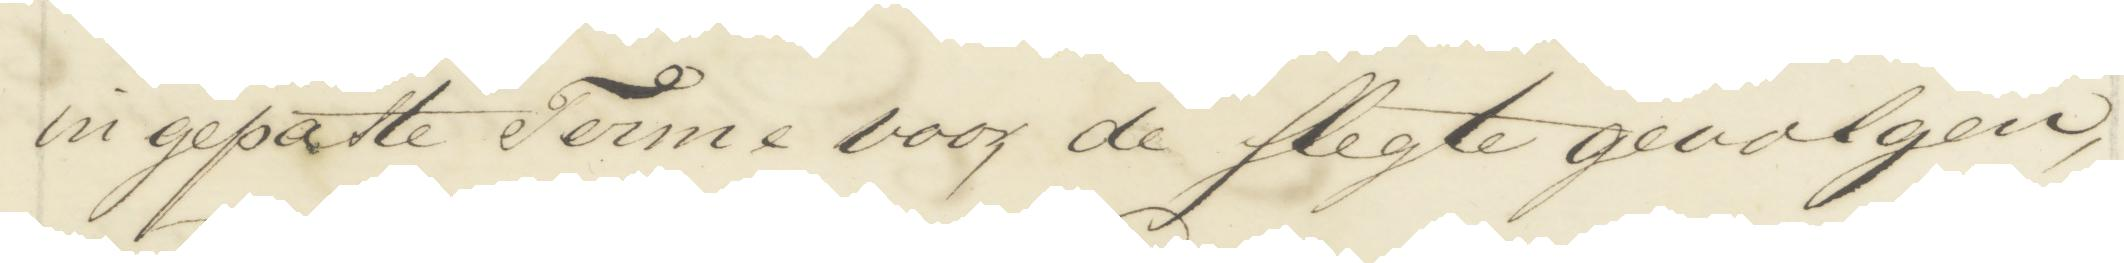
in gepaste Terme voor de slegte gevolgen,
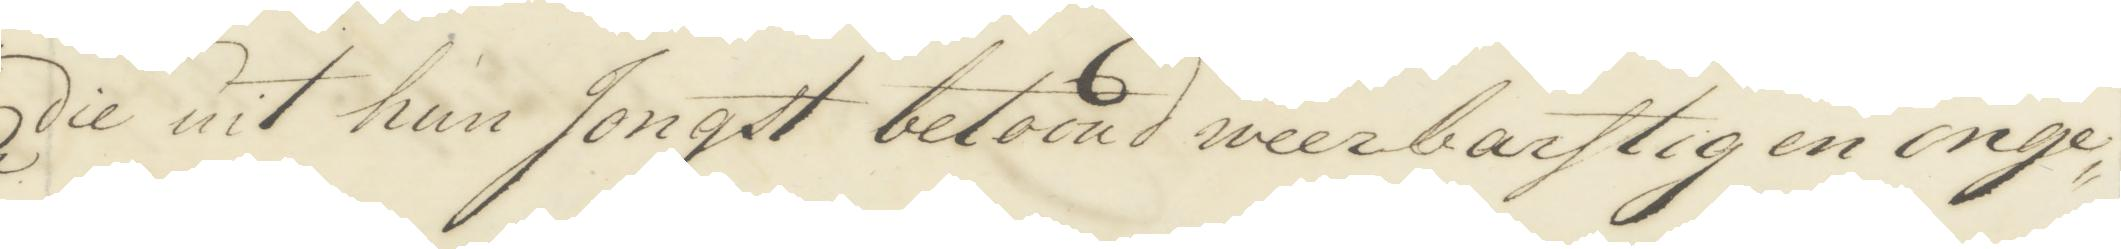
die uit hun Jongst betoond weerbarstig en onge„
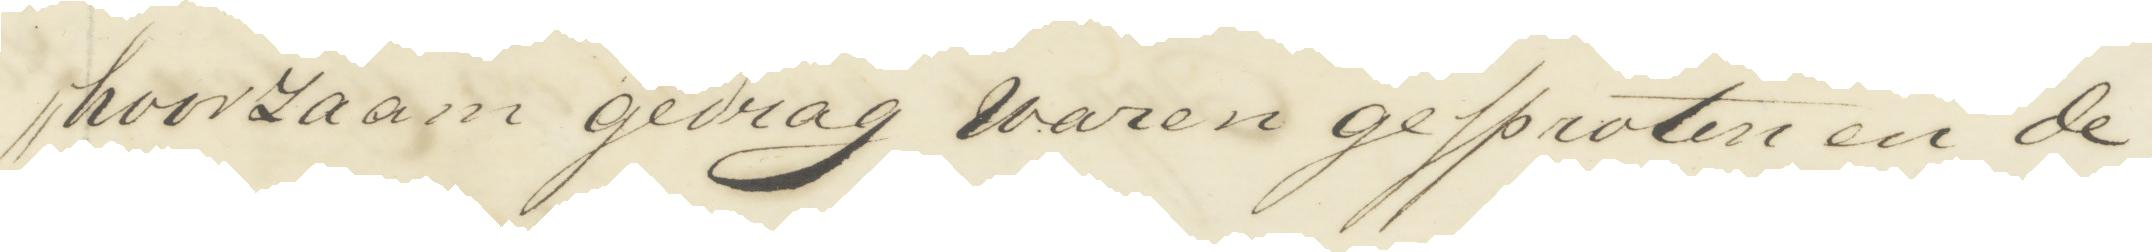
„hoorzaam gedrag waren gesproten en de
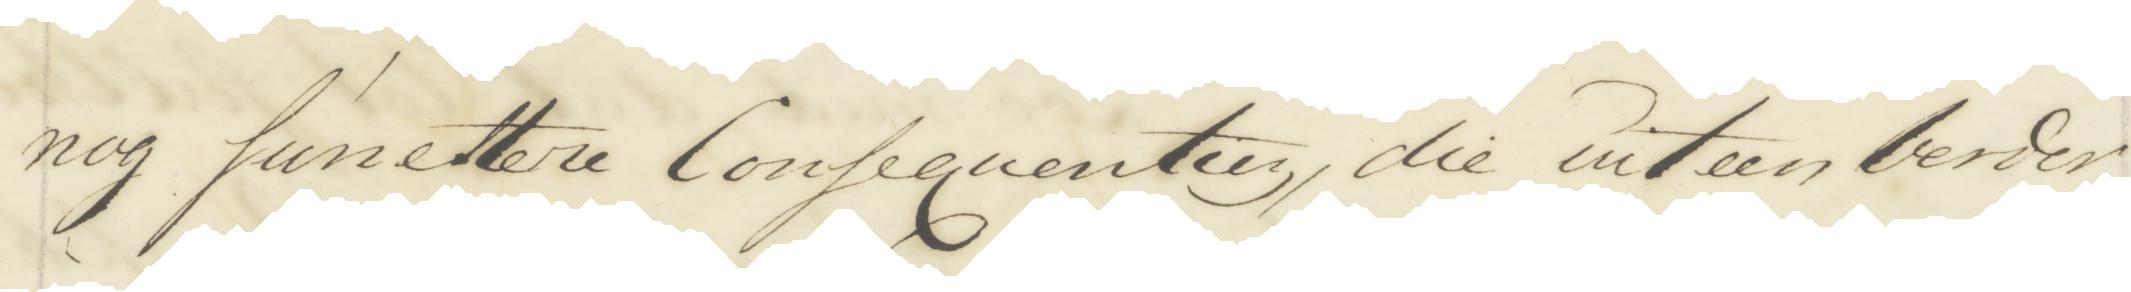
nog funestere Consequentien, die uit een verder
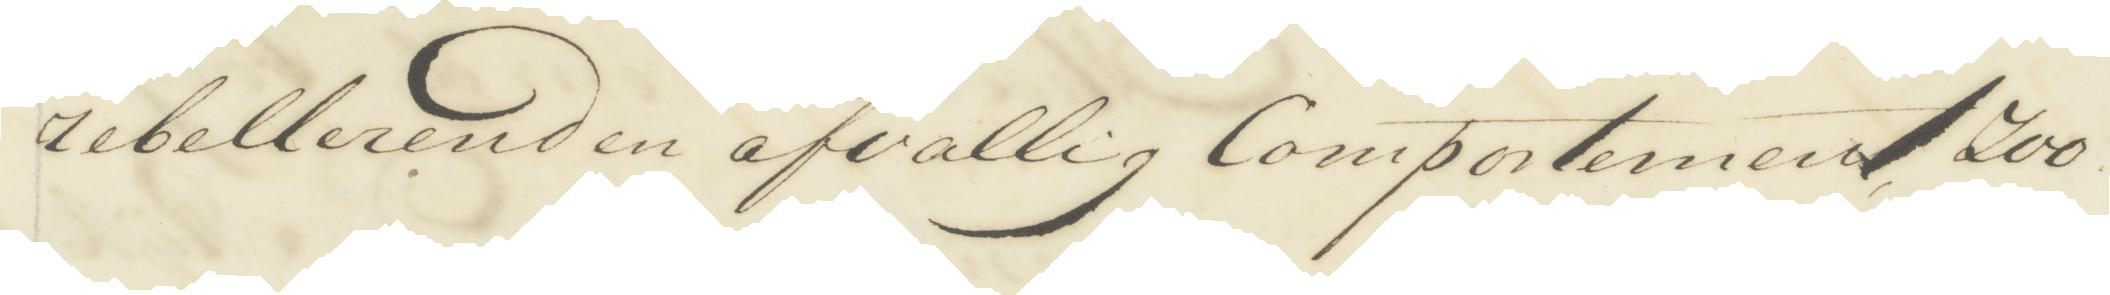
rebellerenden afvallig Comportement, zoo
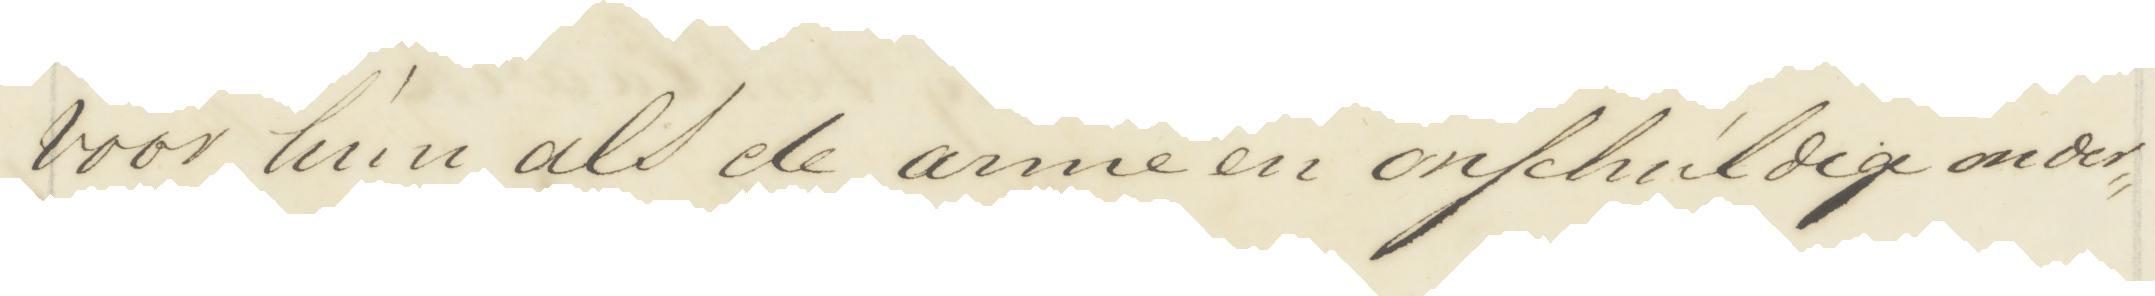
voor hun als de arme en onschuldige onder„
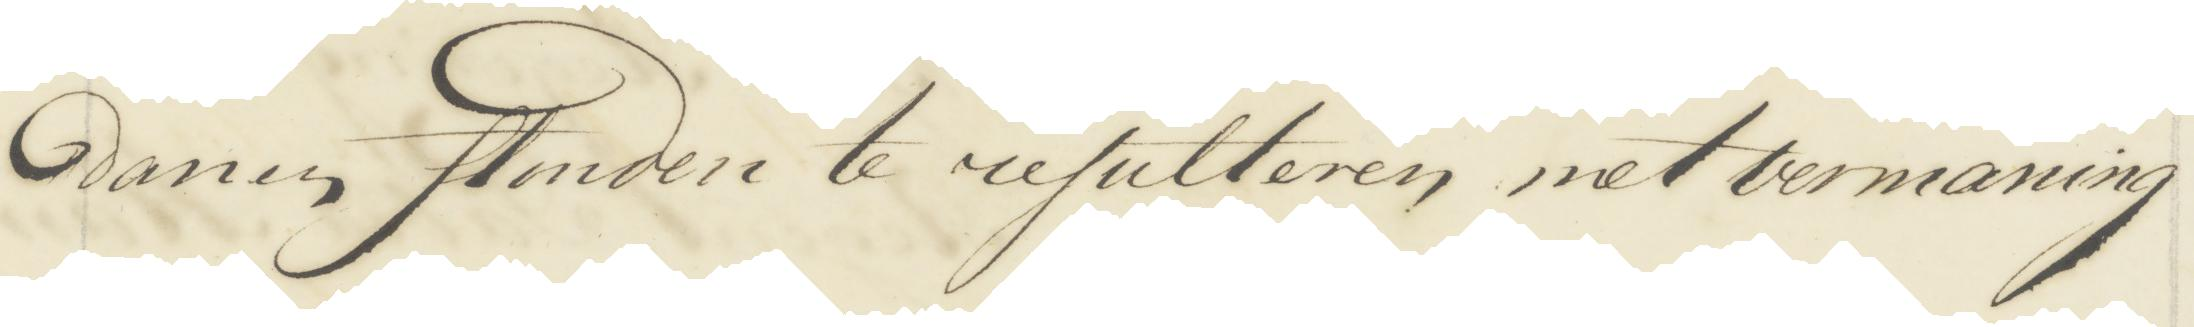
danen stonden te resulteren met vermaning
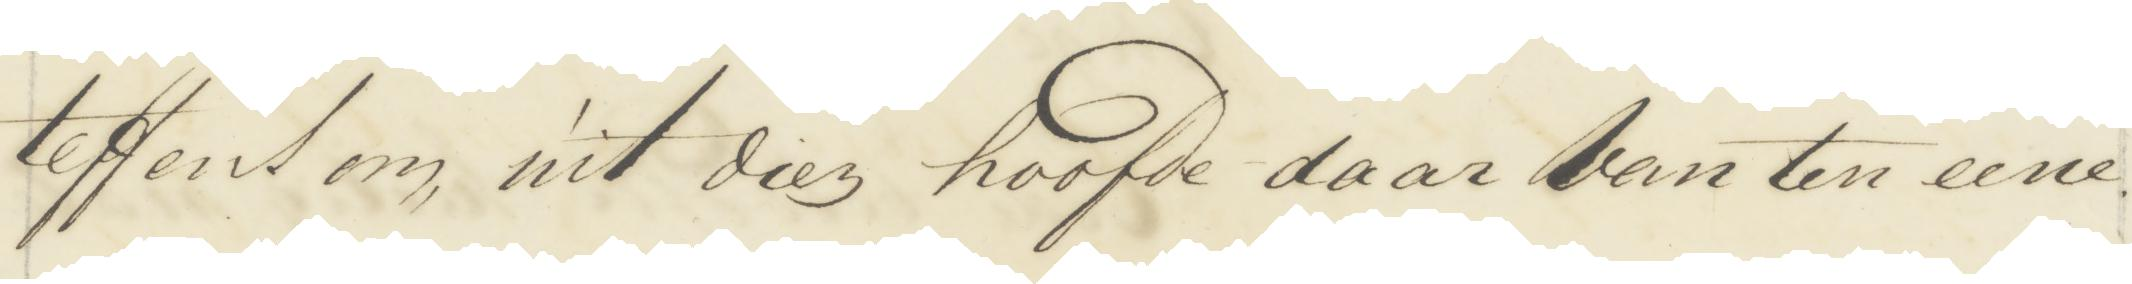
teffens om, uit dien hoofde daar van ten eene
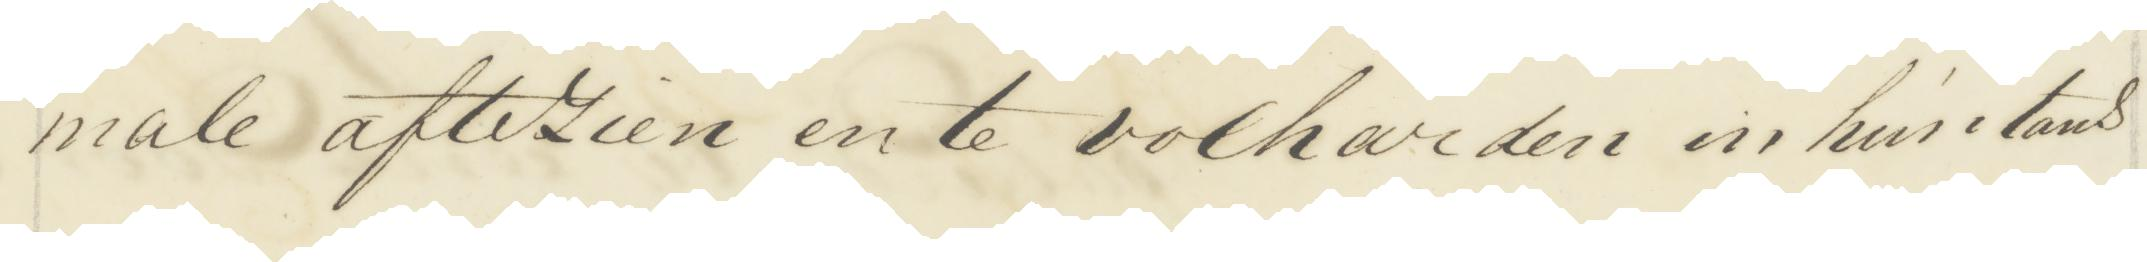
male aftezien en te volharden in hun tans
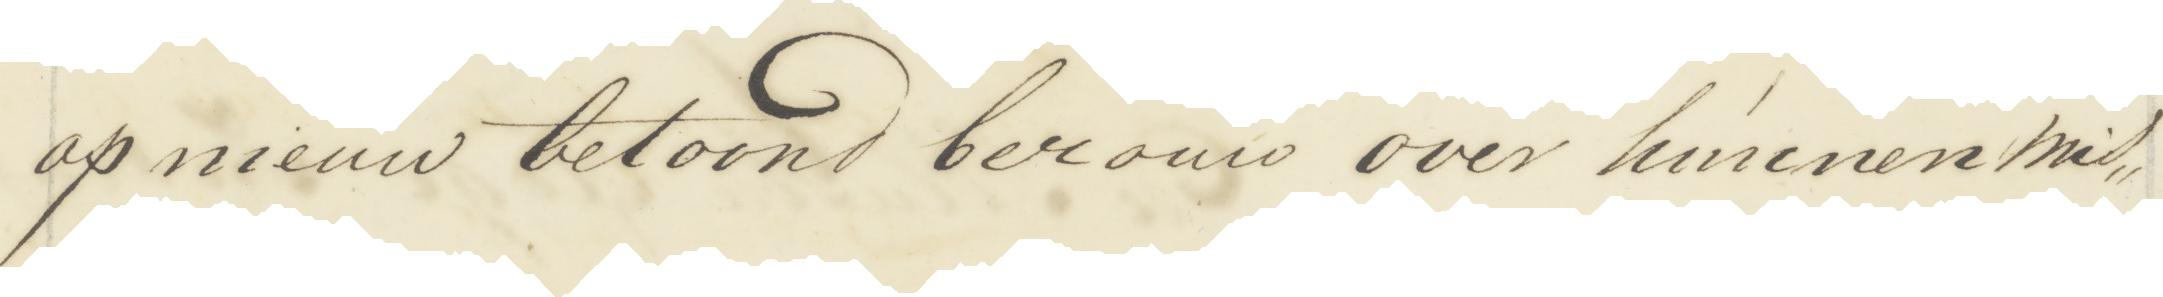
op nieuw betoond berouw over hunnen mis„
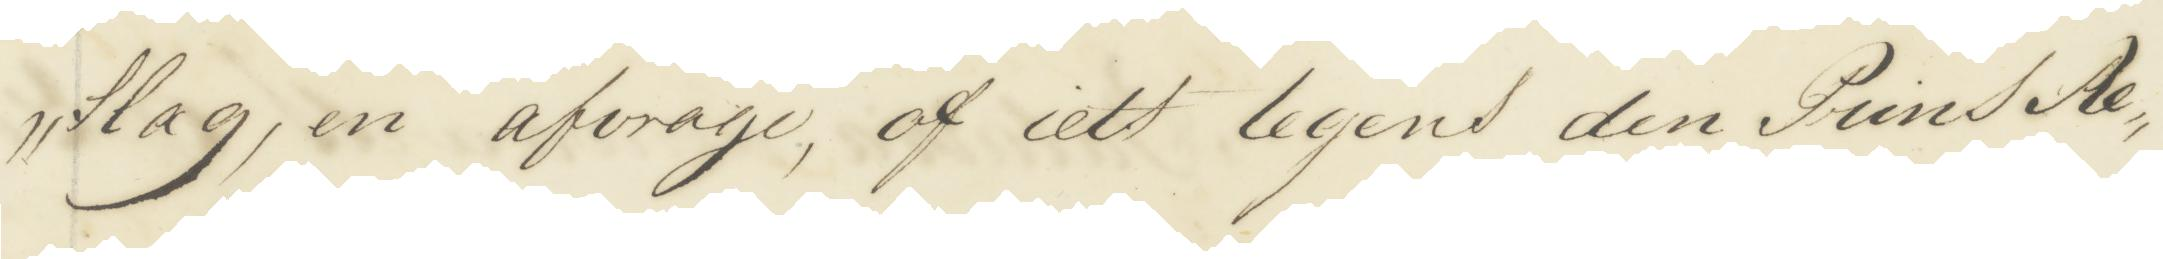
„slag, en afvrage, of iets tegens den Prins Re„
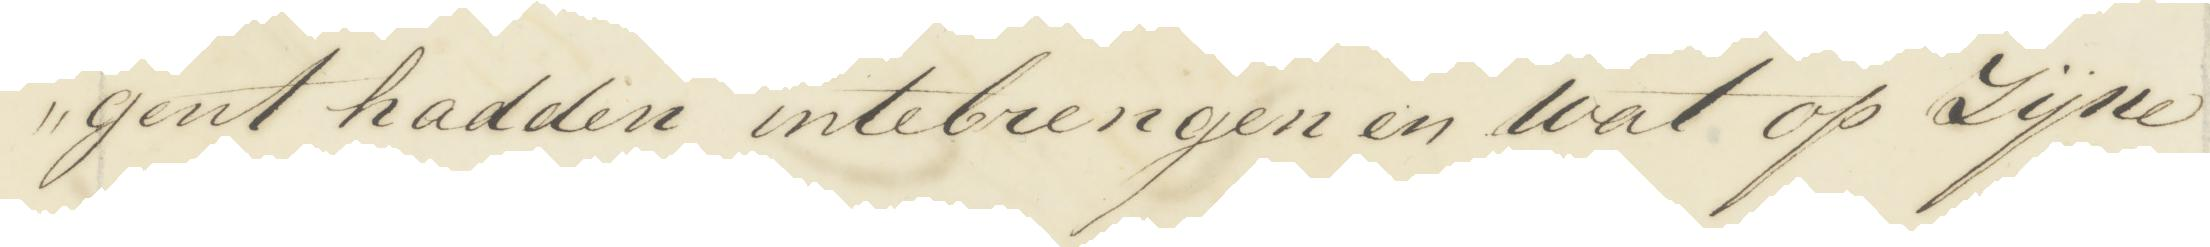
„gent hadden intebrengen en wat op zijne
